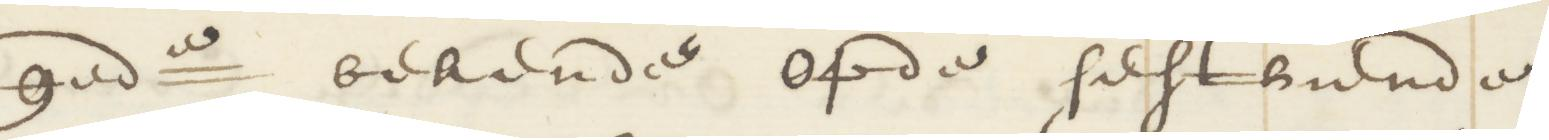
ged=e bekende op de sesthiende
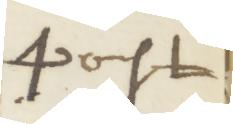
post
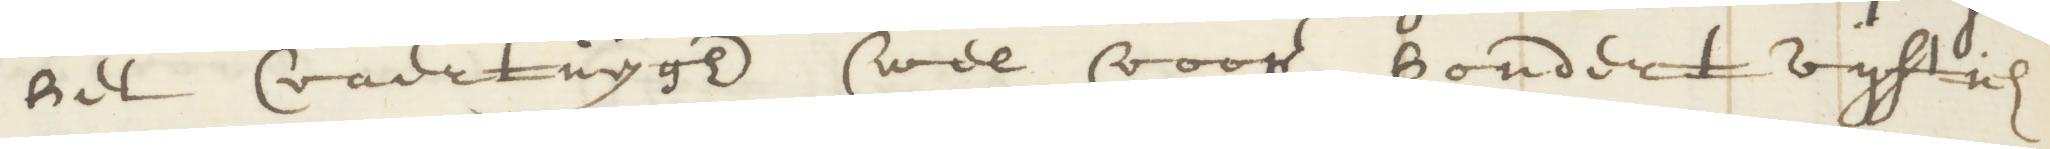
het vaertuijgh wel voor hondert vijftich
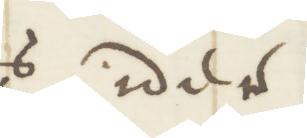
s ider
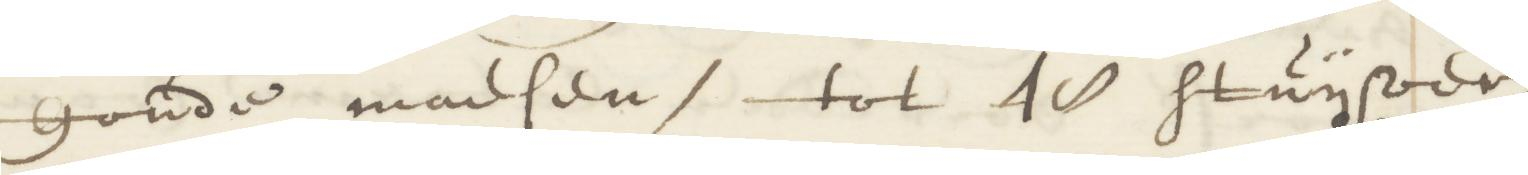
goude maesen, tot 48 stuijver
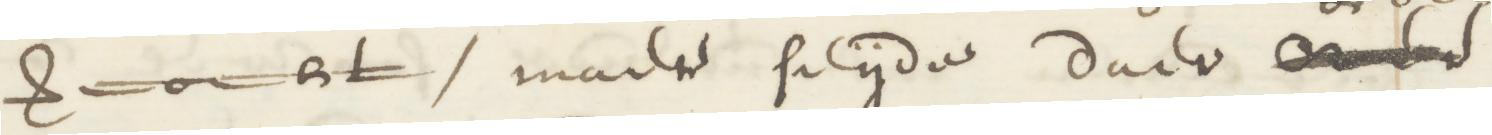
vercocht, maer seijde daer over
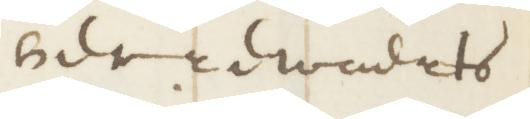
herrewaerts
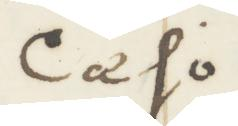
Caso
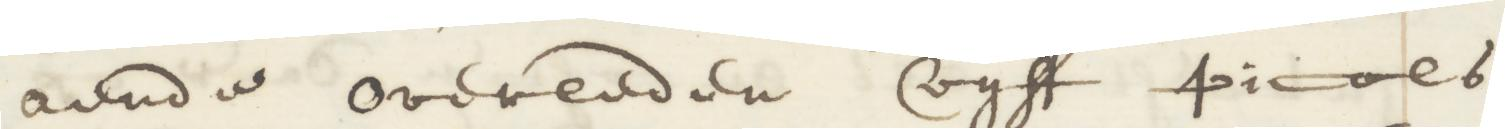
aende overleden vijff picals
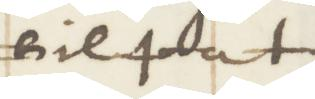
hilpat
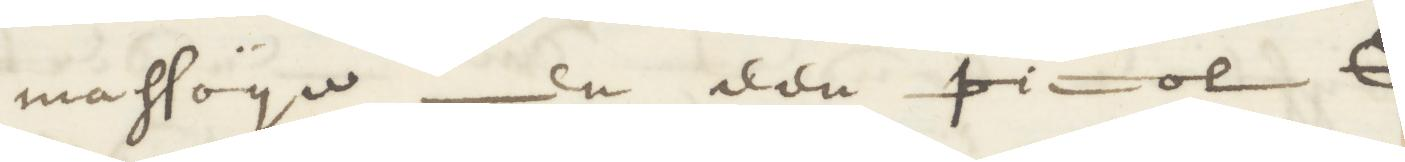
massoije en een picol
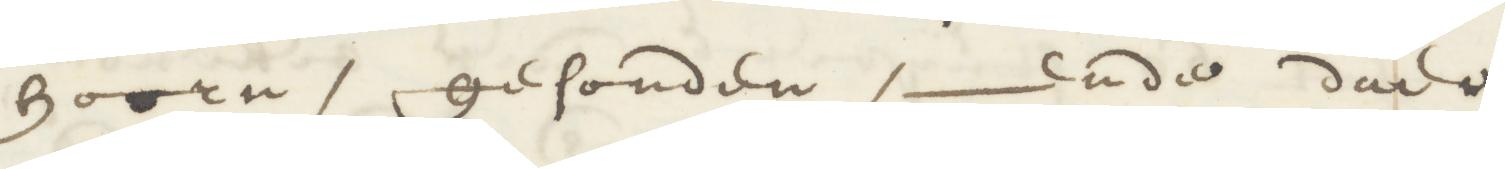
hoorn, gesonden, ende daer
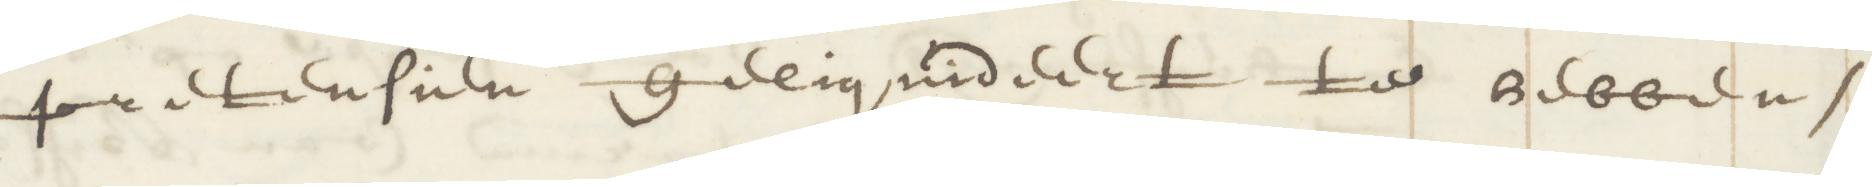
pretensien geliquideert te hebben/.
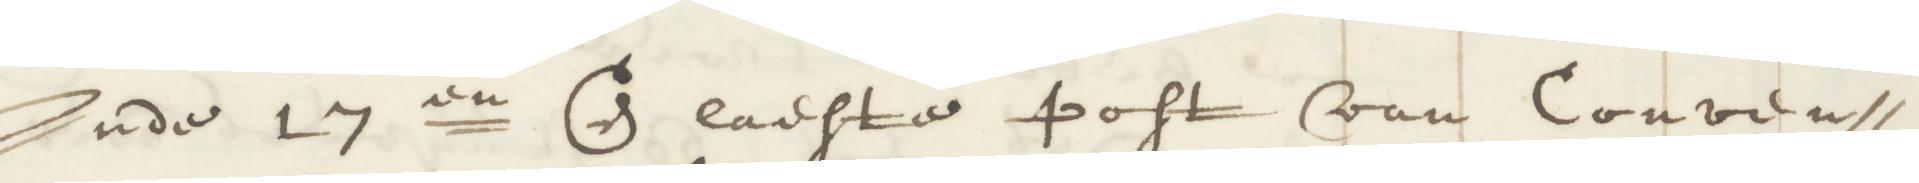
Ende 17=en ende laeste post van Conven„
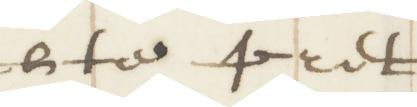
hte pret
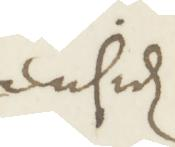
ensie
